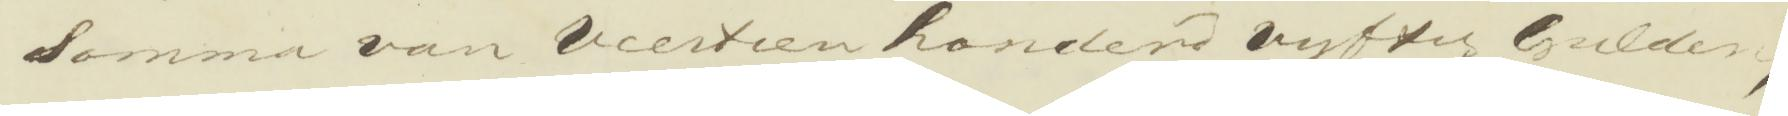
somma van Veertien honderd vyftig Gulden,
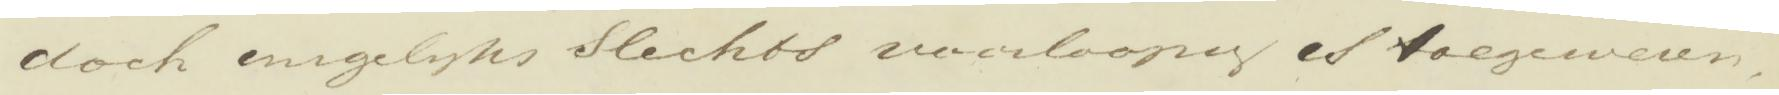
doch insgelyks slechts voorloopen is toegewezen,
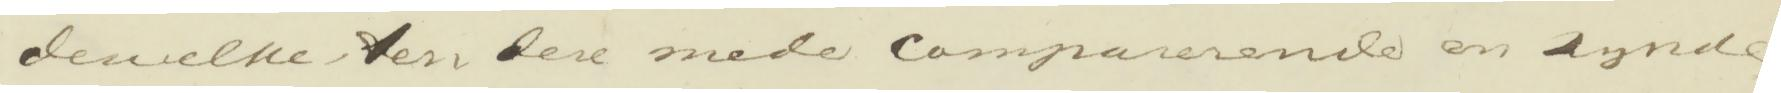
dewelke ten deze mede comparerende en zynde
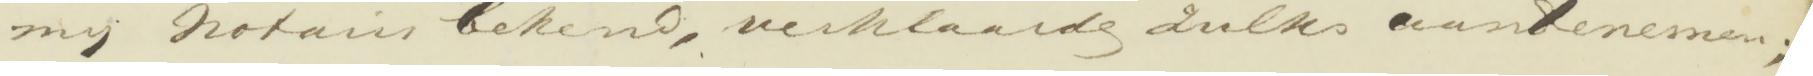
mij notaris bekend, verklaarde zulks aantenemen;
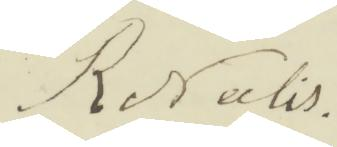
R Neelis.
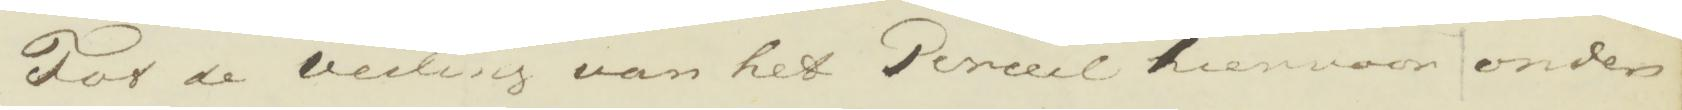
Tot de veiling van het Perceel hiervoor onder
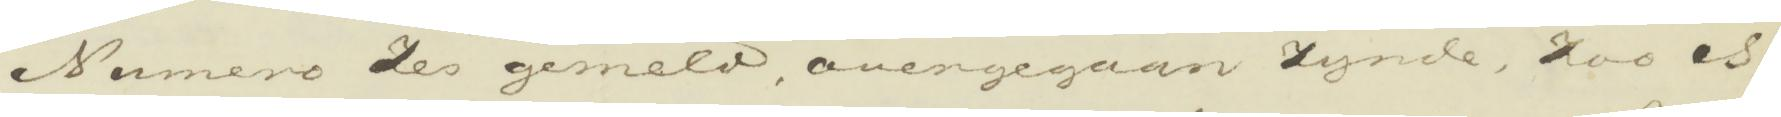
Numero zes gemeld, overgegaan zijnde, zoo is
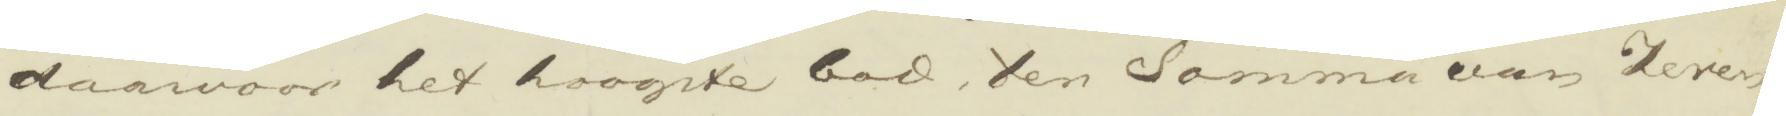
daarvoor het hoogste bod, den somma van Zeven
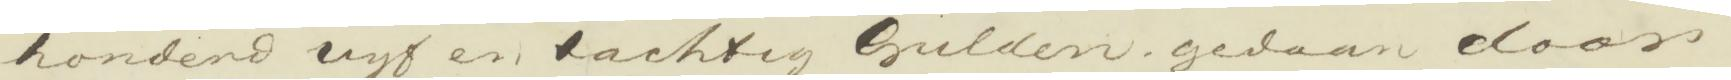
honderd vijf en tachtig Gulden, gedaan door
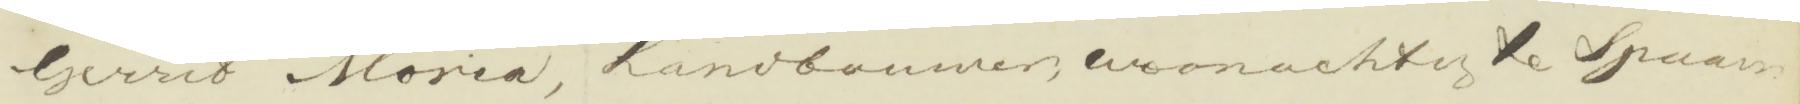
Gerrit Moria, Landbouwer, woonachtig te Spaarn
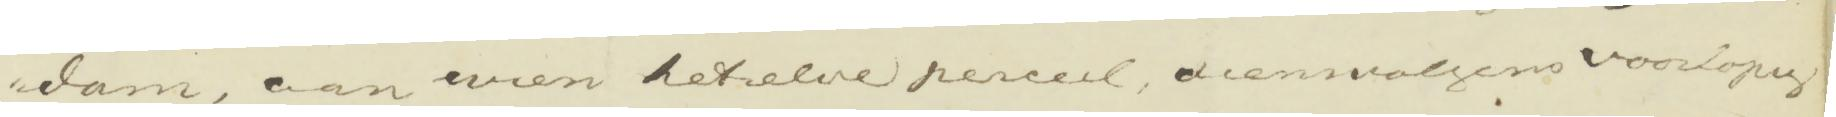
„dam, aan wien hetzelve perceel, diensvolgens voorlopig
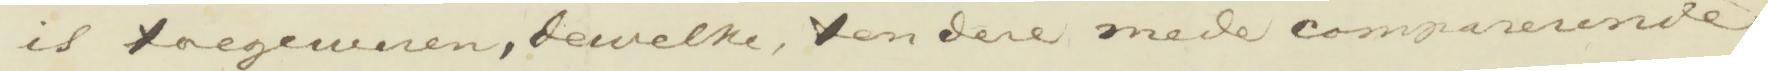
is toegewezen, dewelke, ten deze mede comparerende
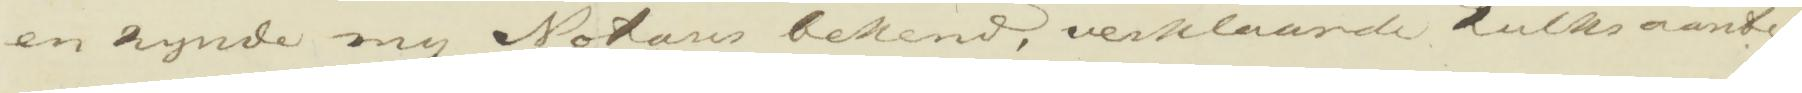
en zynde my Notaris bekend, verklaarde zulks aante
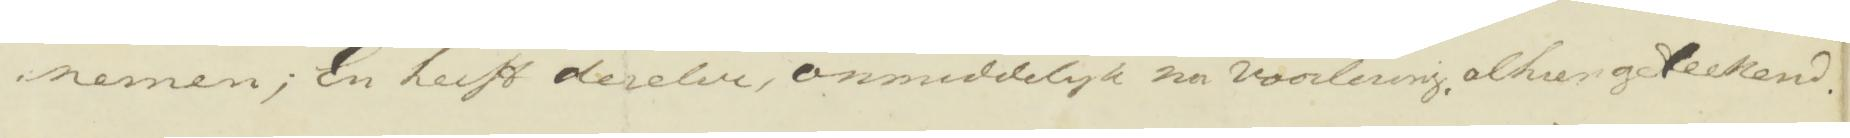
nemen; En heeft dezelve, onmiddelyk na voorlezing, alhier geteekend.
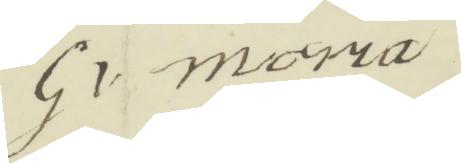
Gt Moria
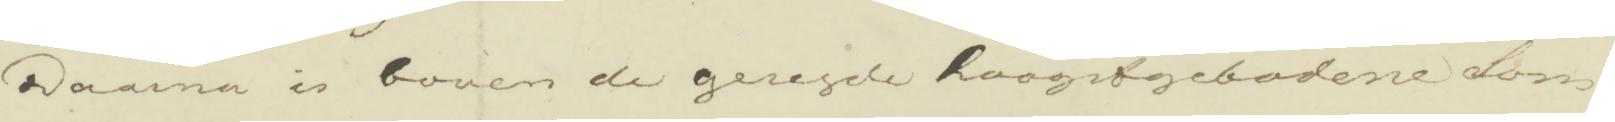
Daarna is boven de gezegde hoogstgebodene som
